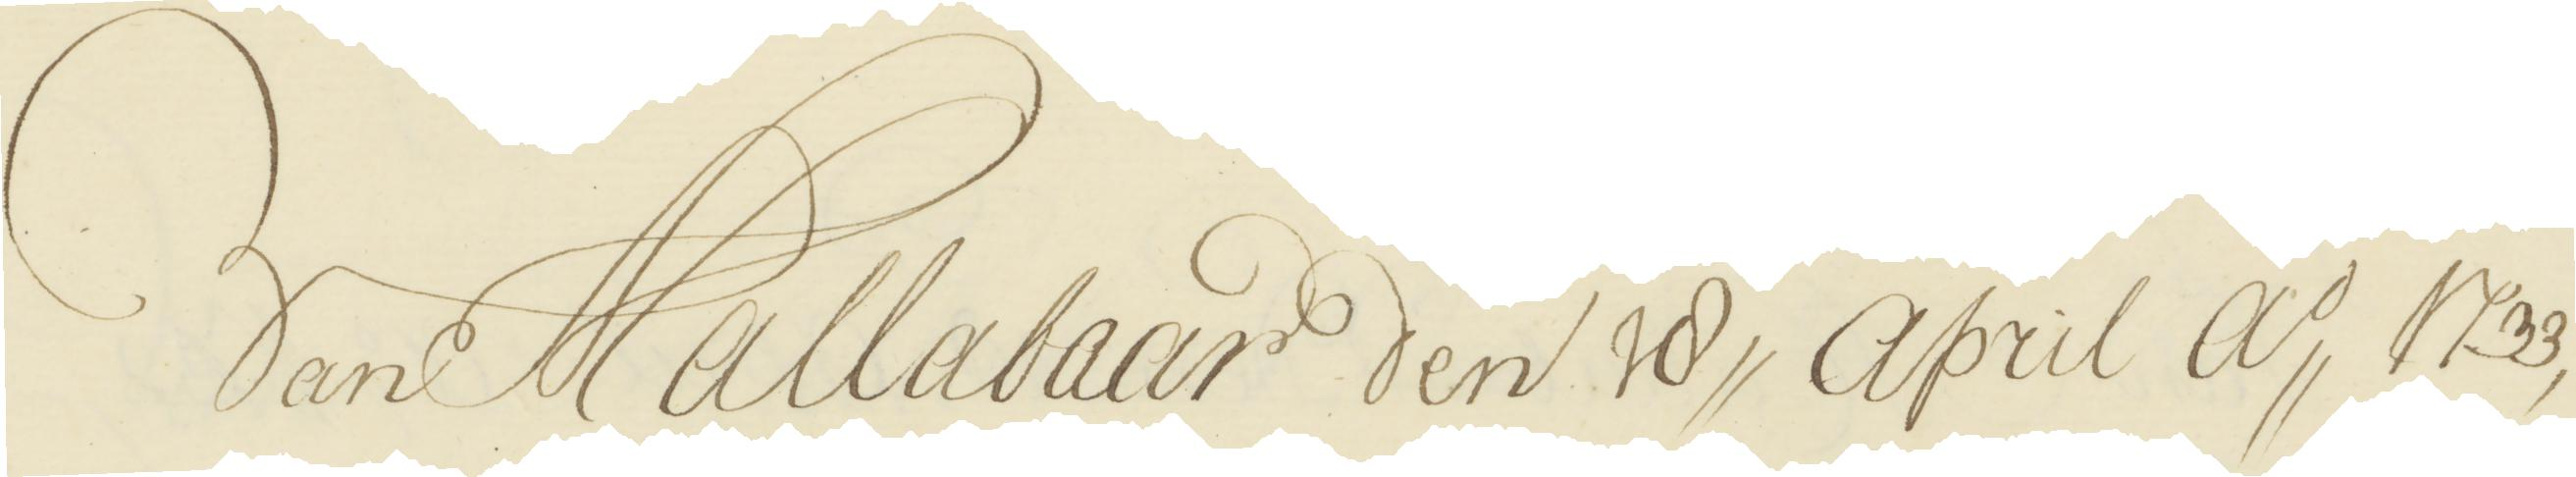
Van Mallabaar den 18„' April A„o 1733,
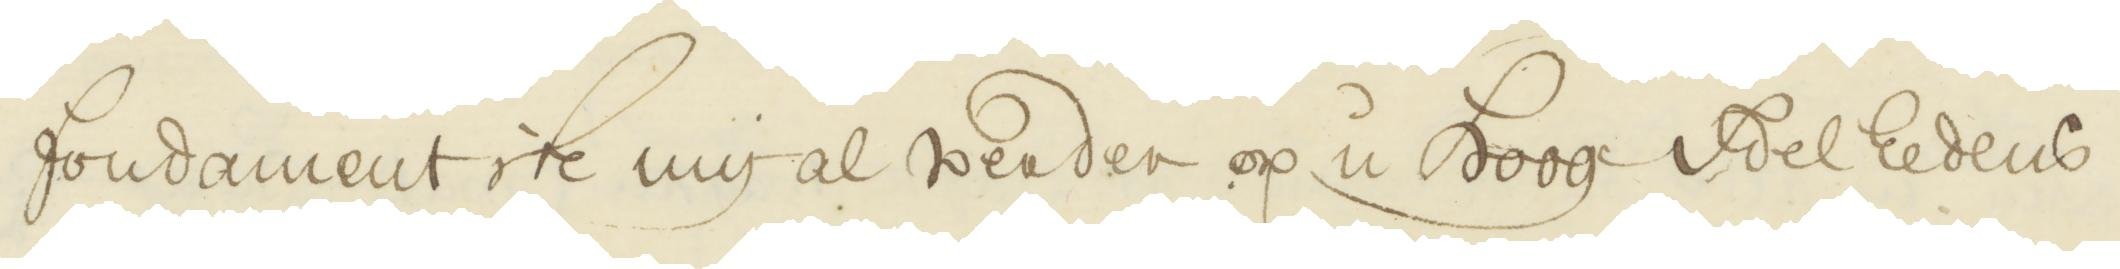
fondament ik mij al verder op u Hoog Edelhedens
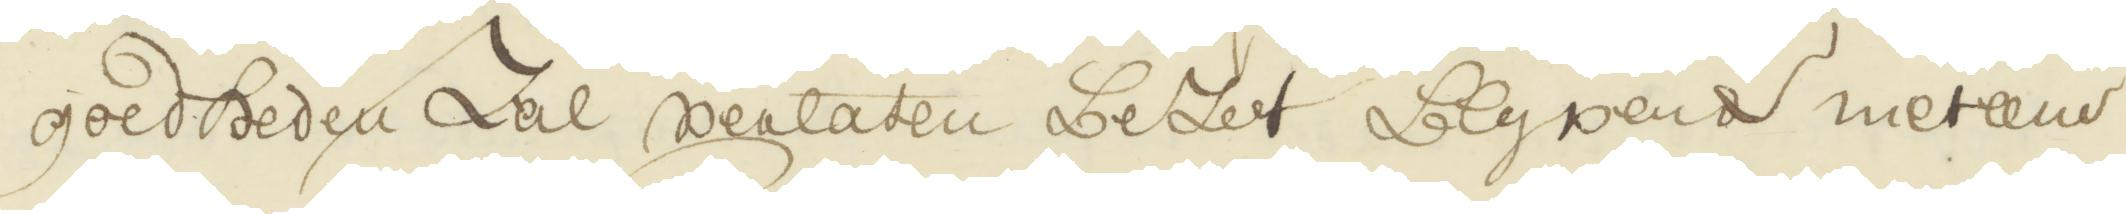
goedheden zal verlaten bezet blyvende met eene
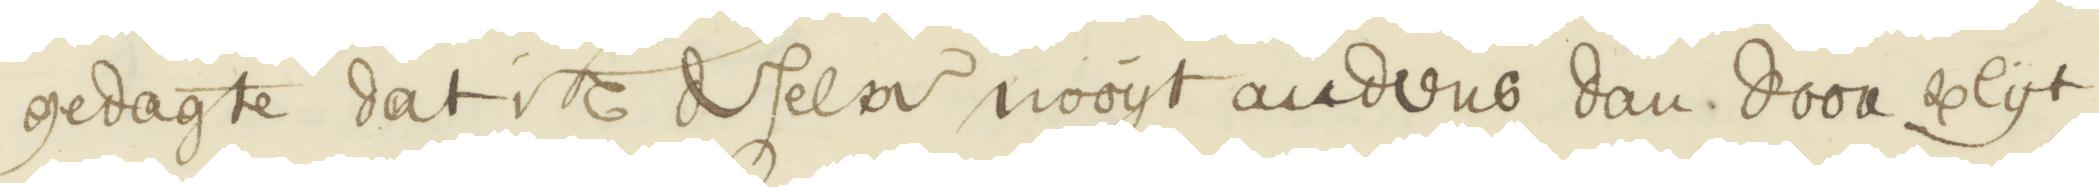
gedagte dat ik deselve nooijt anders dan door vlijt
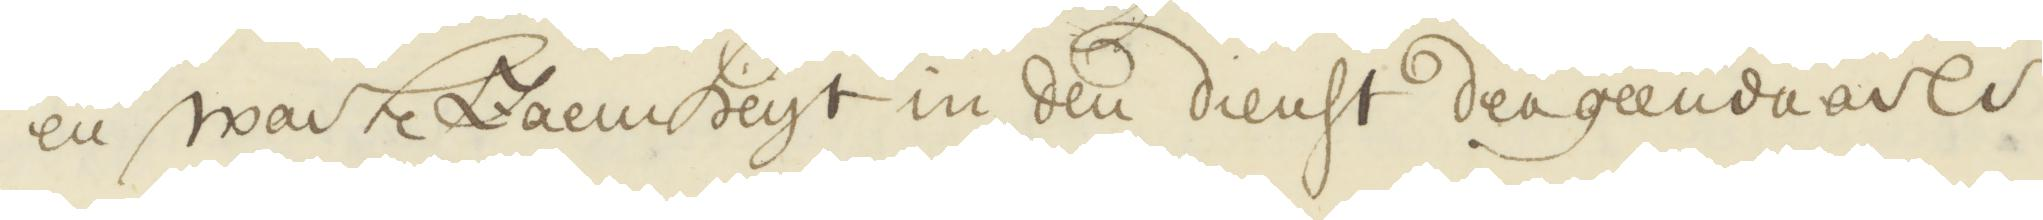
en waekzaemheijt in den dienst der geeneraele
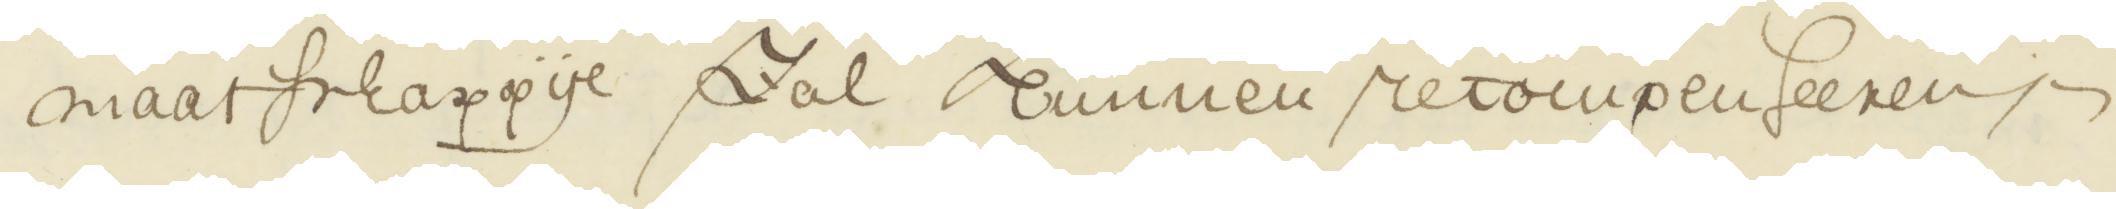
maatschappije zal kunnen recompenseeren, –
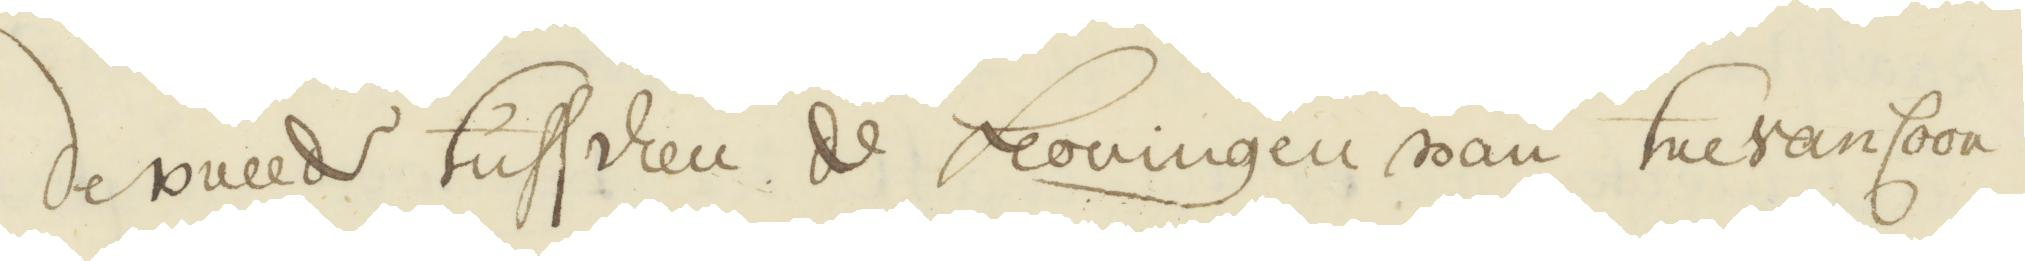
de vreede tusschen de koningen van trevancoor
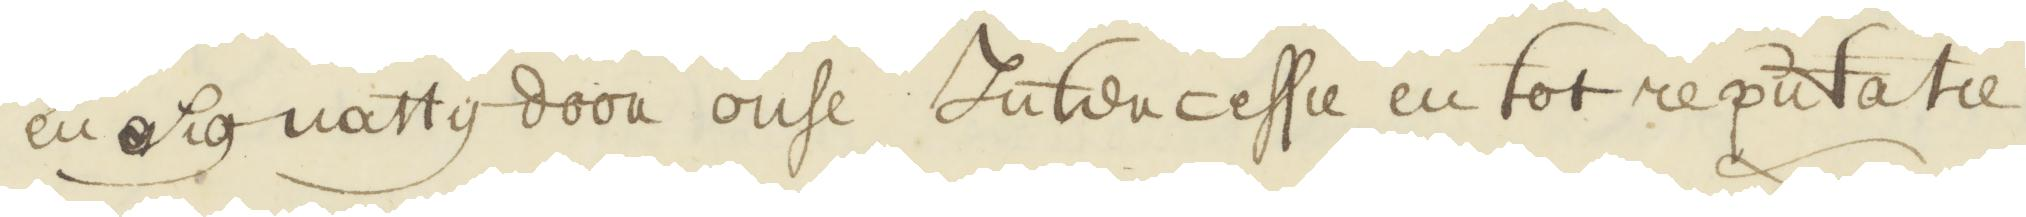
en signattij door onse Intercessie en tot reputatie
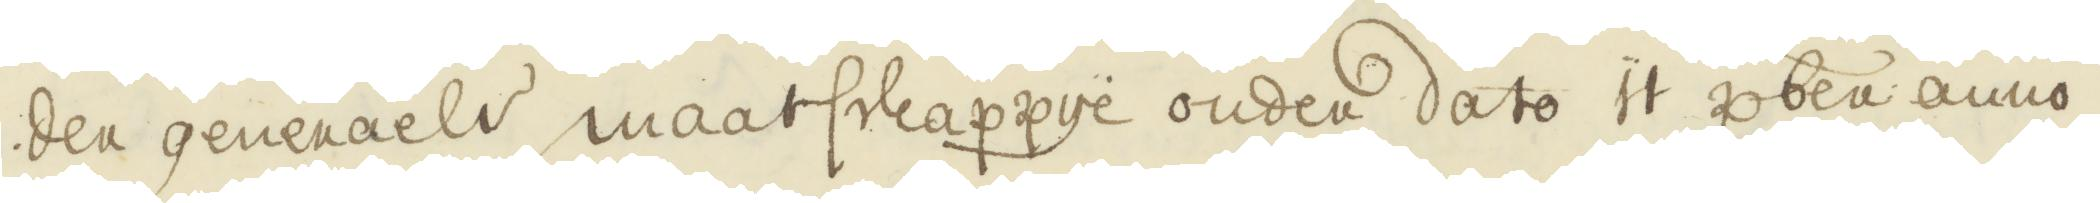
der generaele maatschappije onder dato 11 xber anno
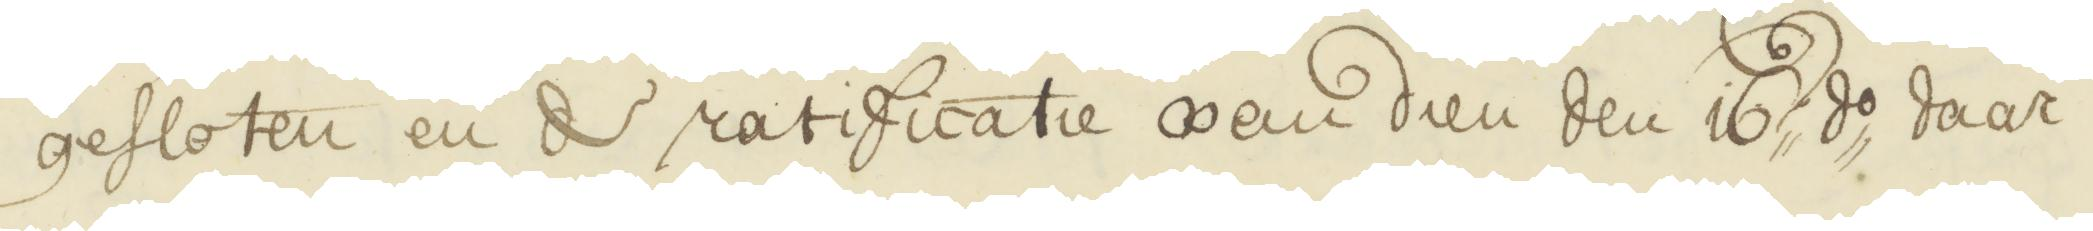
gesloten en de ratificatie van dien den 16„' d„o daar
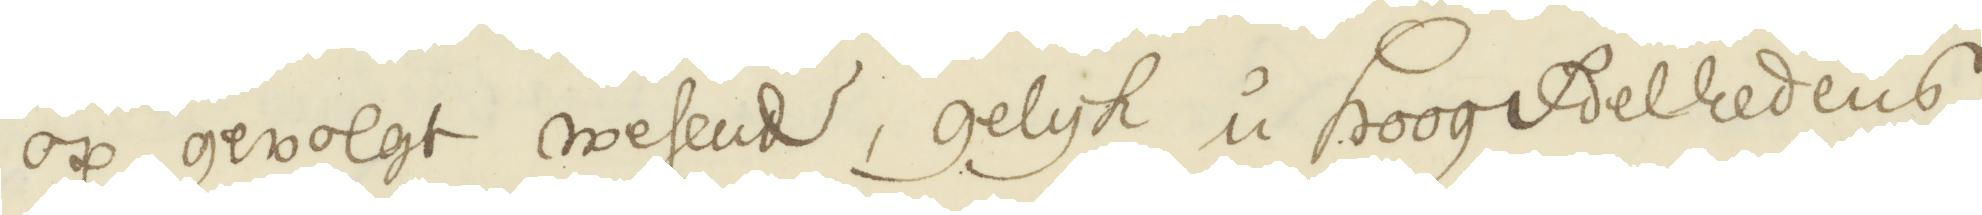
op gevolgt wesende, gelyk u hoog Edelhedens
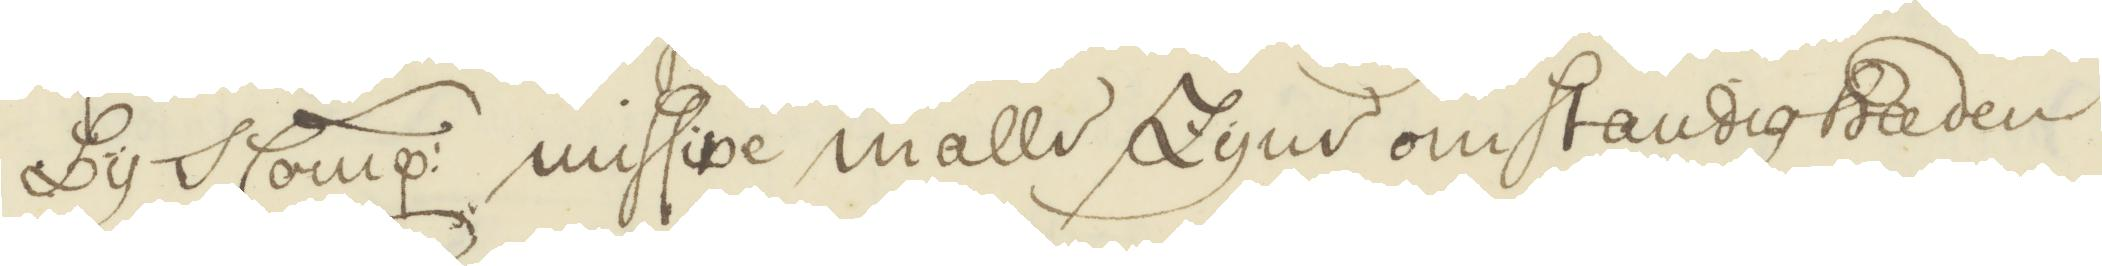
bij sComp: missive in alle zijne omstandigheeden
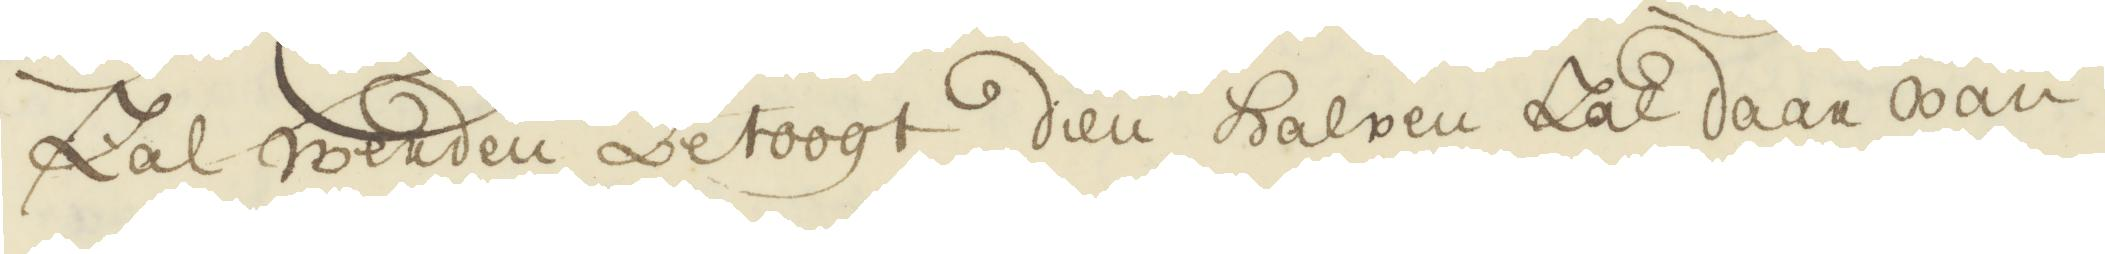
zal werden betoogt dien halven zal daar van
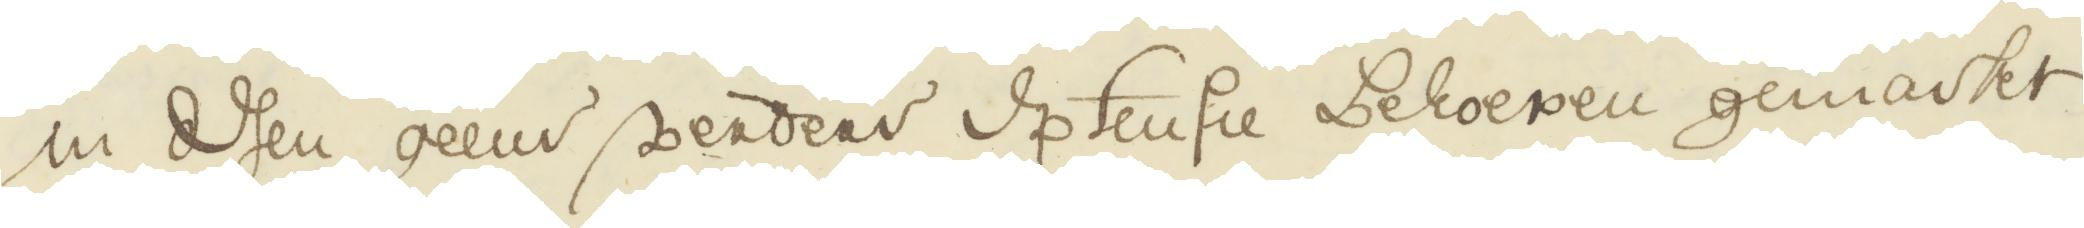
in desen geene verdere Extensie behoeven gemaekt
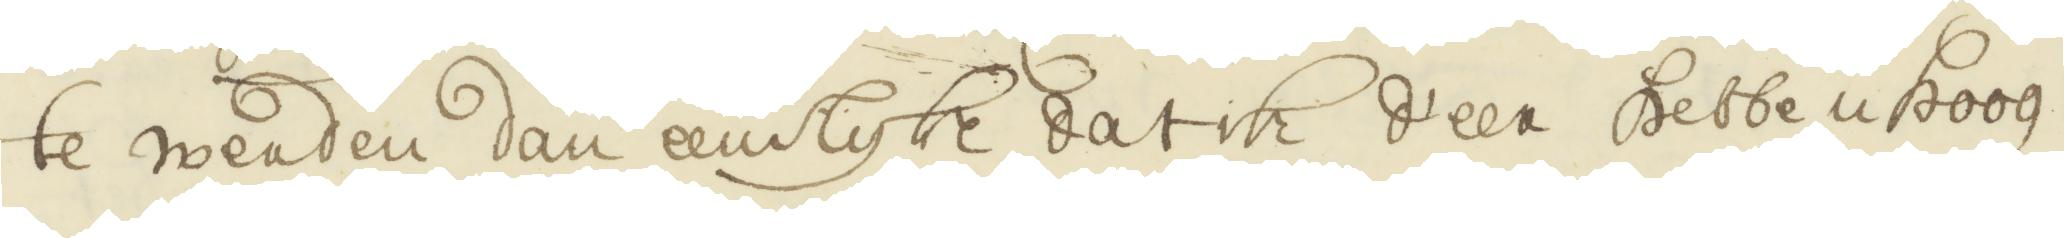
te werden dan eenelyk dat ik d'eer hebbe u hoog
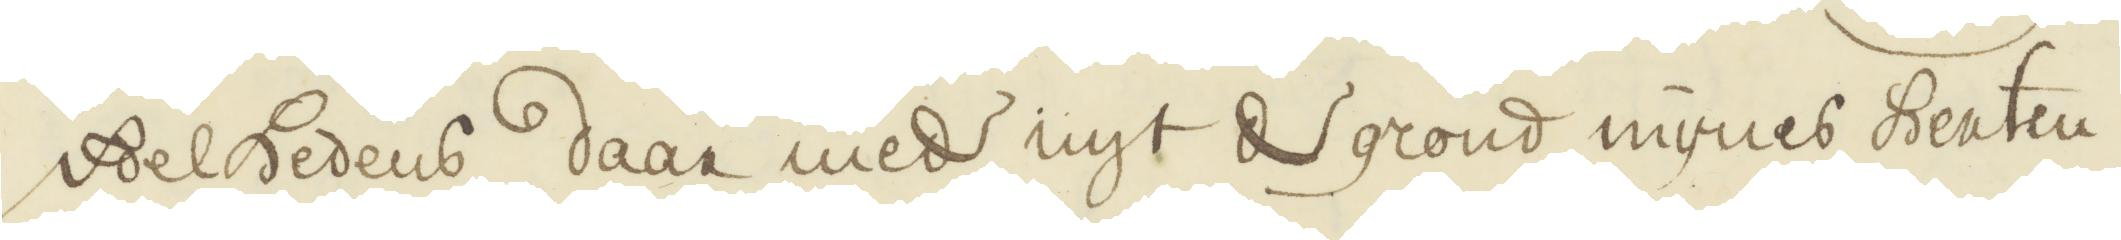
Edelhedens daar mede uijt de grond mijnes herten
